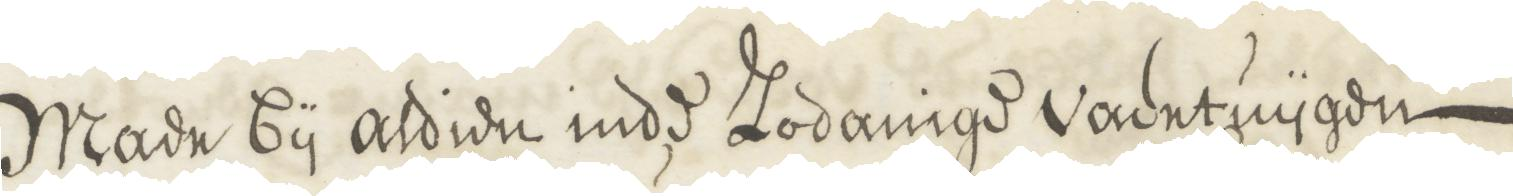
Maer bij aldien inde zodanige vaertuijgen
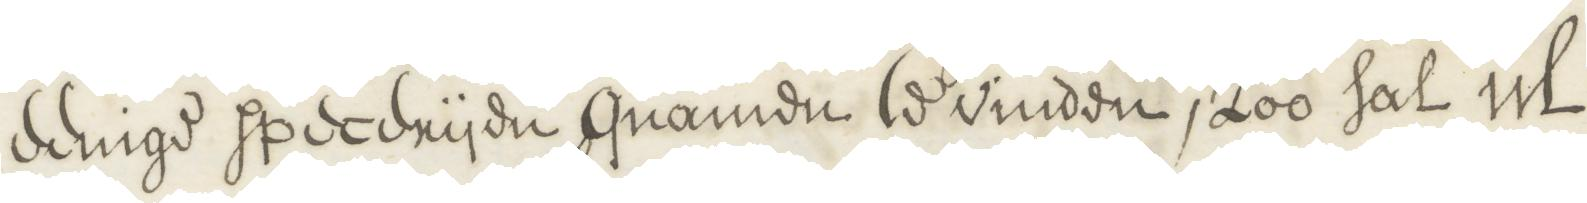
eenige specerijen quamen te vinden, zoo sal Ul
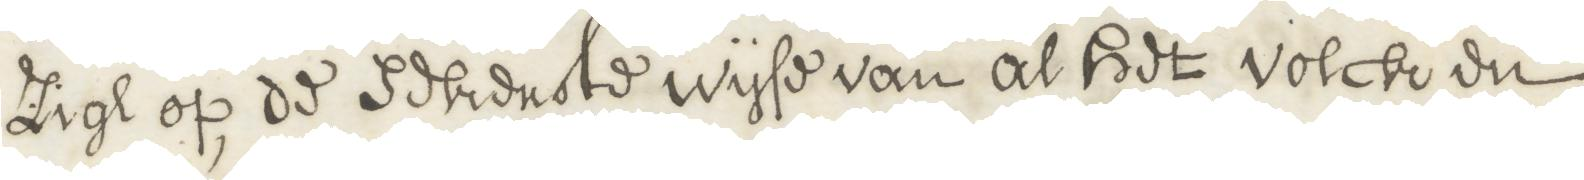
zigh op de sekerste wijse van al het volck en
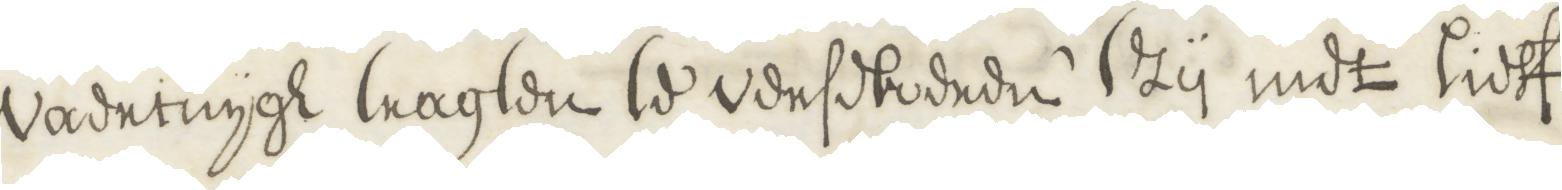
vaertuijgh tragten te versekeren 't zij met lieff
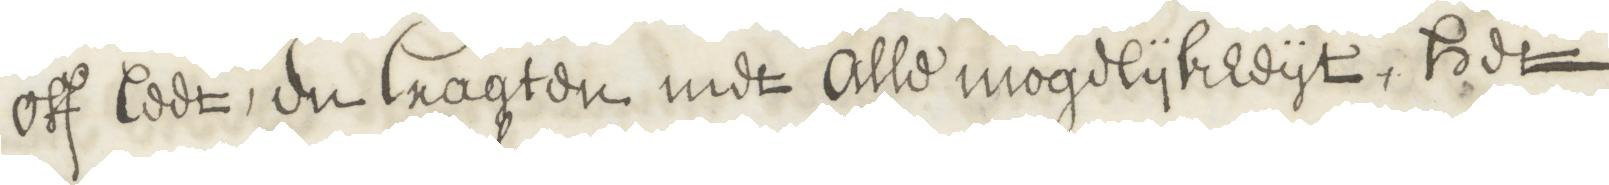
off leet, en tragten met alle mogelijkheijt, het
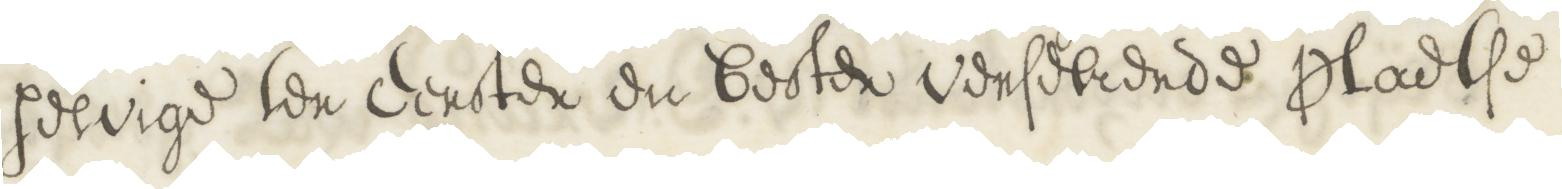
selvige ter Eerster en bester versekerde plaetse
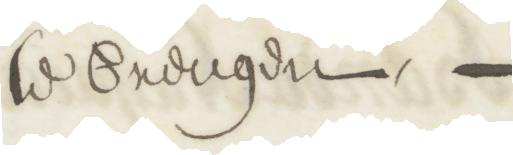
te brengen, —
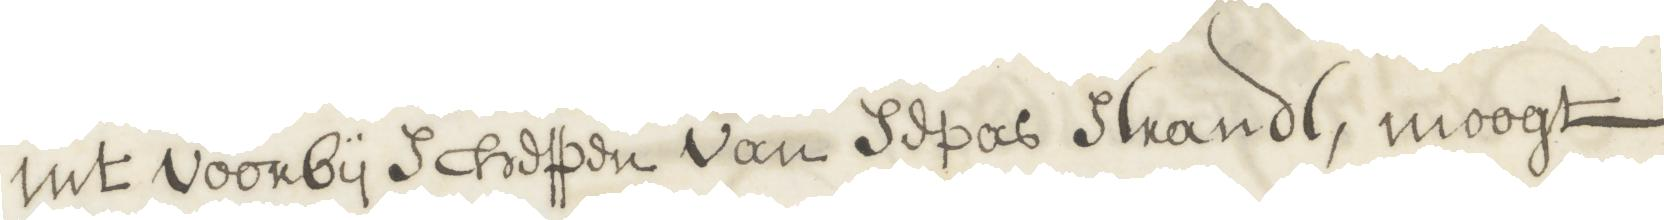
int voorbij scheppen van sepas strandt, moogt
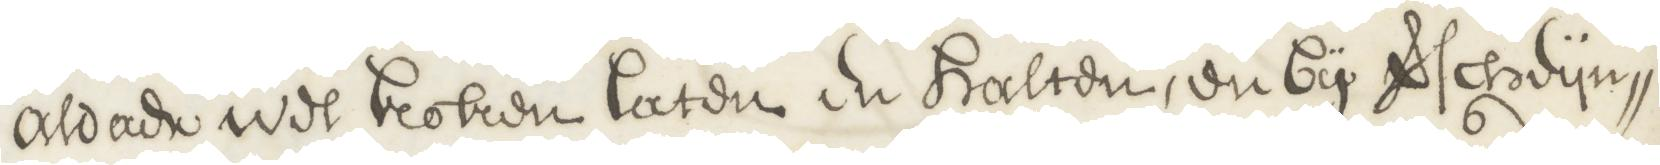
aldaer wel koken laten en halten, en bij verscheijn„
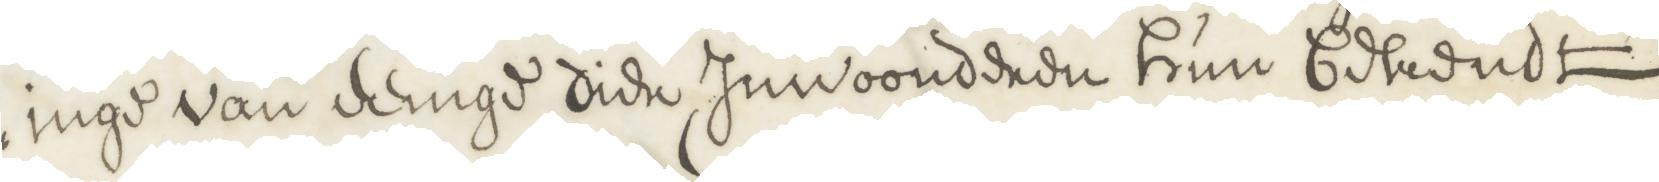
„inge van eenige dier Inwoonderen hun bekendt
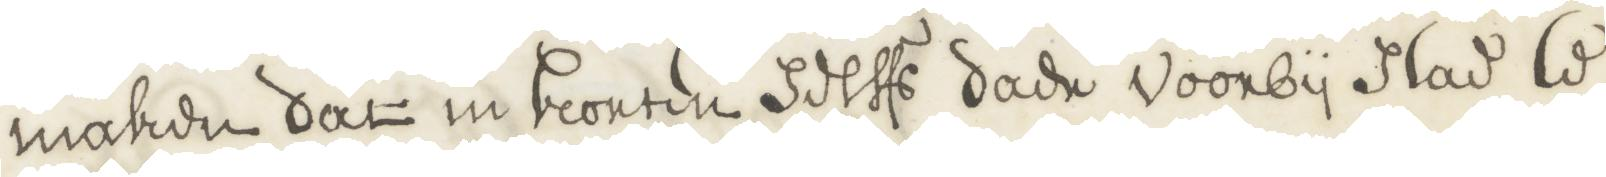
maken dat in korten selffs daer voorbij stae te
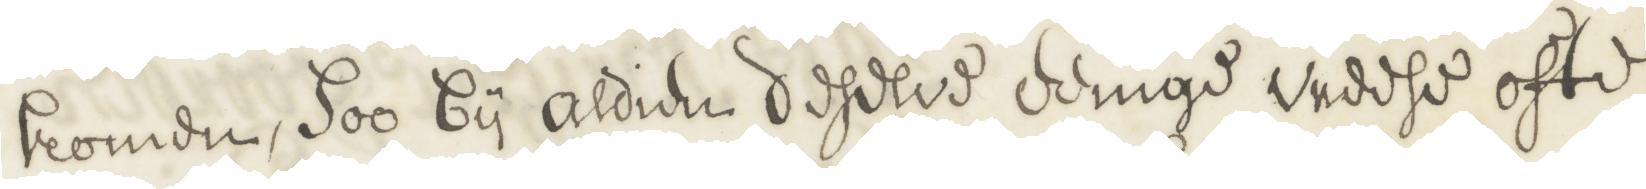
komen, soo bij aldien deselve eenige vreese ofte
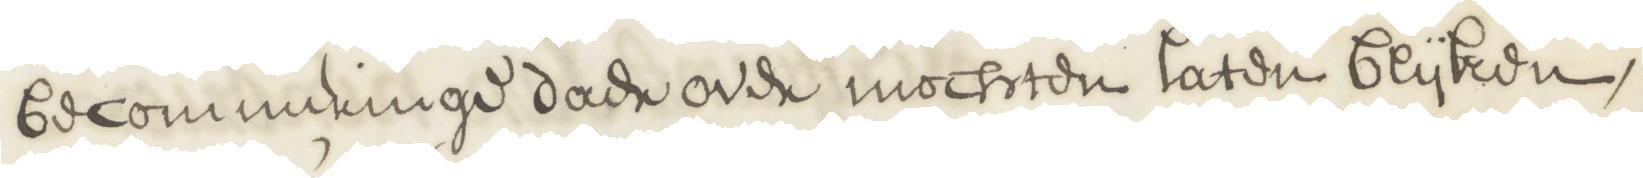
becommeringe daer over mochten laten blijken,
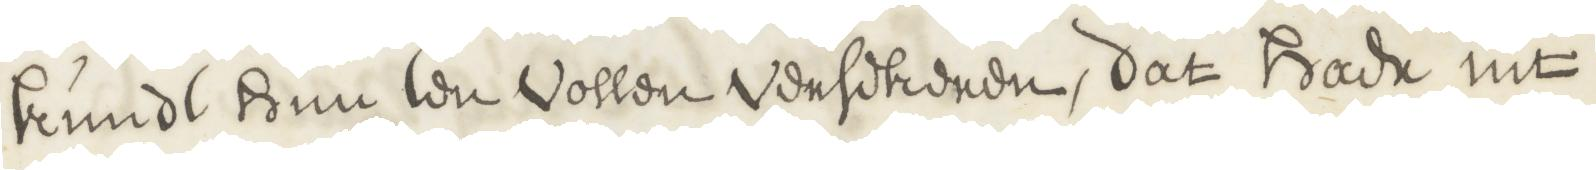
kundt hun ten vollen versekeren, dat haer int
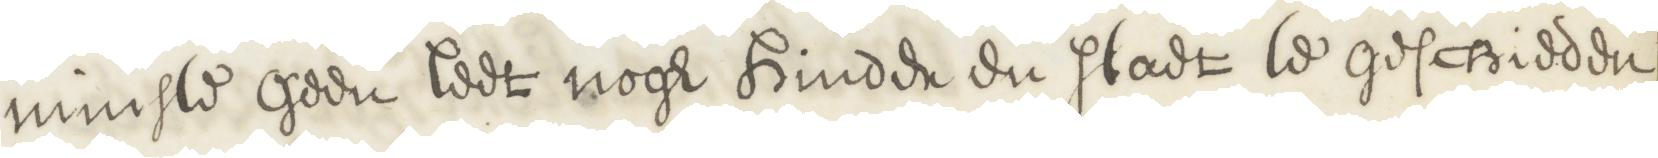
minste geen leet nogh hinder en staet te geschieden
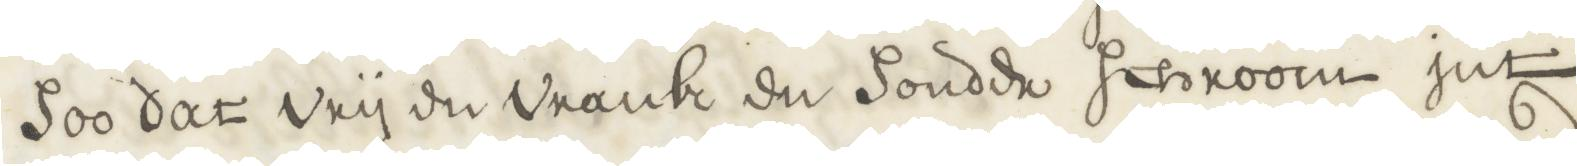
soo dat vrij en vrank en sonder schroom int
